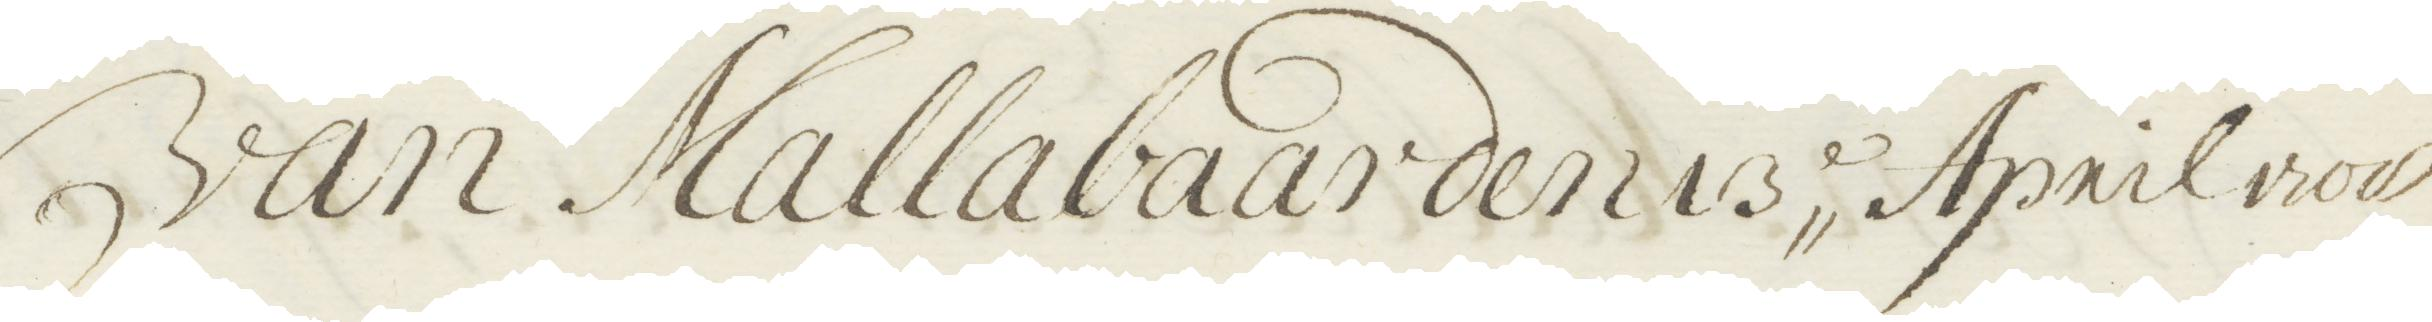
Van Mallabaar den 13„e April 1708
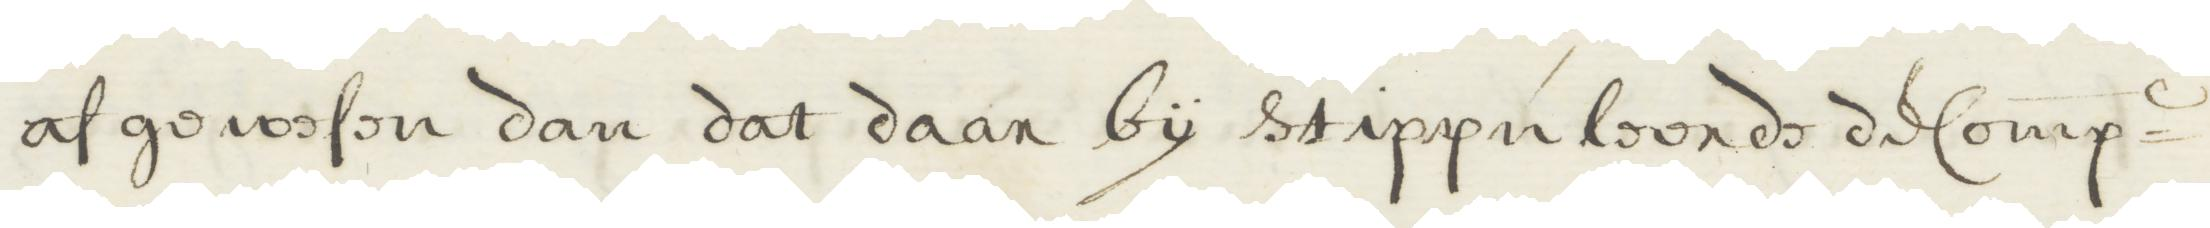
afgewesen dan dat daar bij stippuleerde de Comp=e
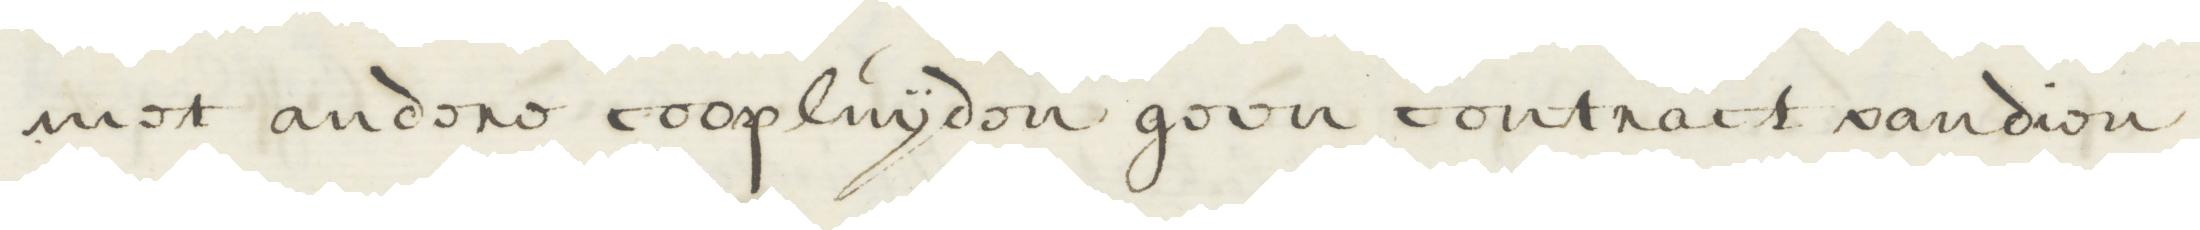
met andere coopluijden geen contract van dien
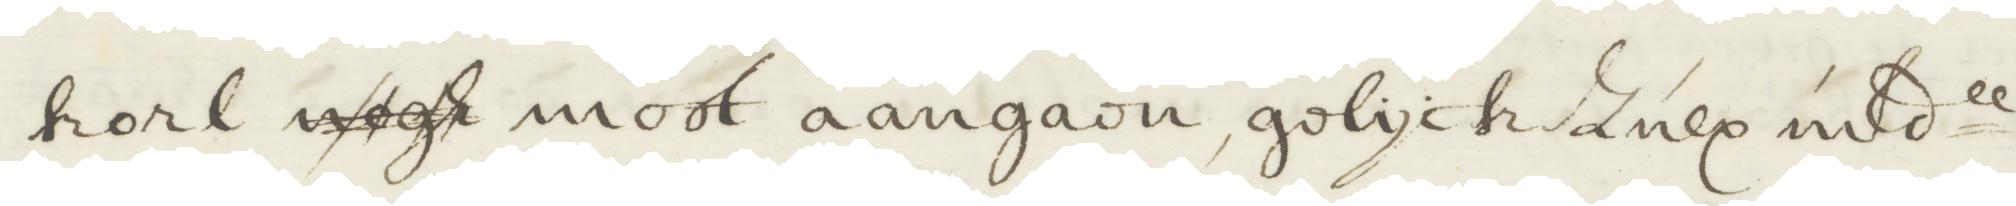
korl nogh most aangaen, gelijck zulx uEd=le
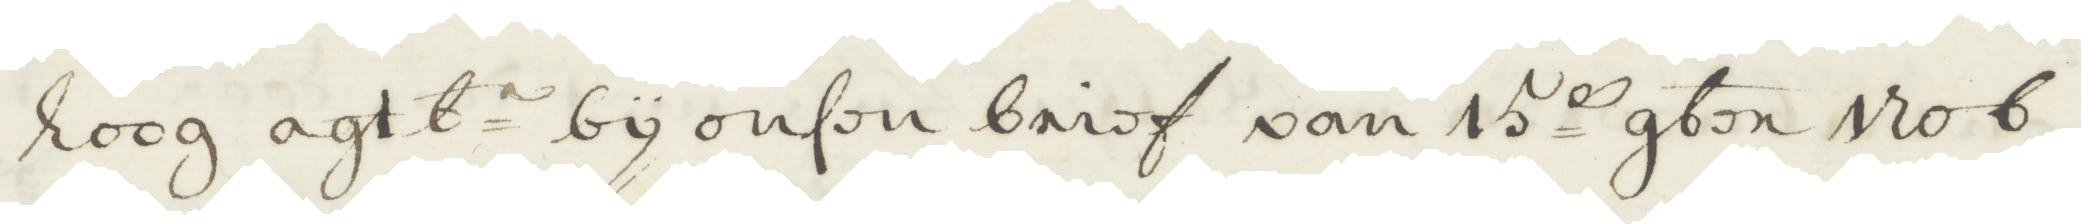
hoog agtb=r bij onsen brief van 15=e 9ber 1706
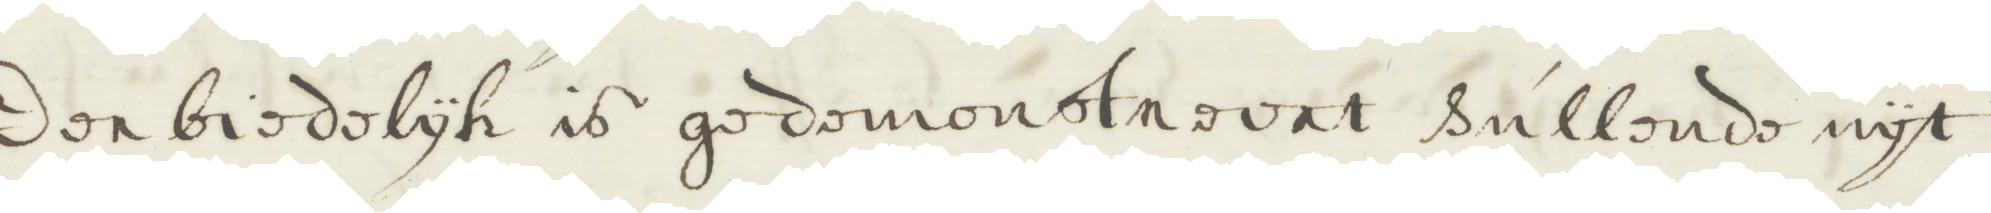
Eerbiedelijk is gedemonstreert sullende uijt
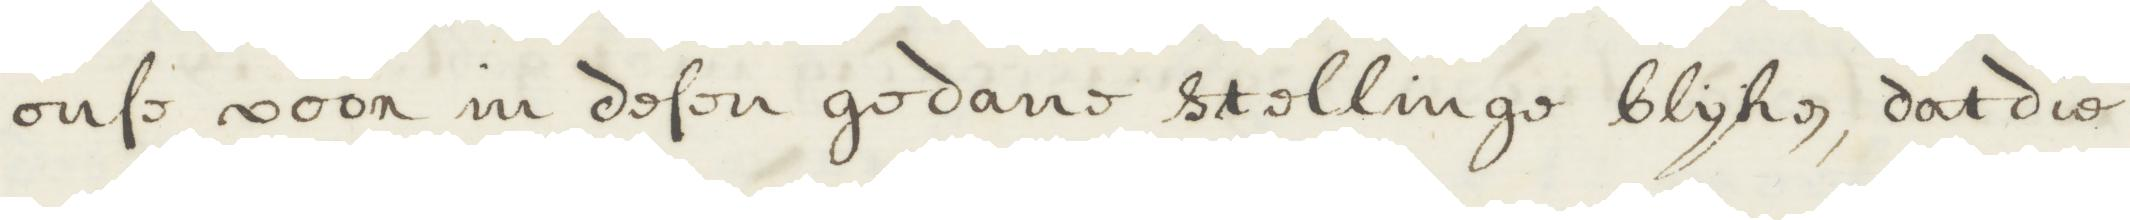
onse voor in desen gedane stellinge blijken, dat die
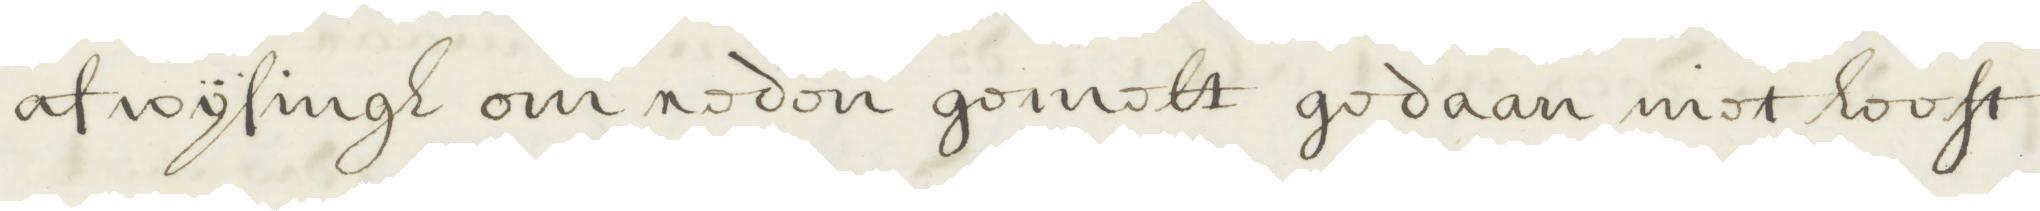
afwijsingh om reden gemelt gedaan, niet heeft
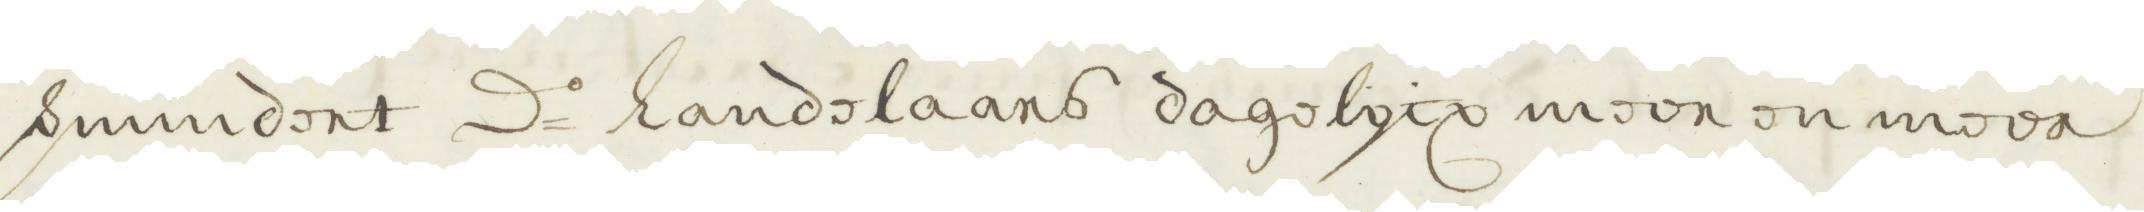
vermindert d=o handslaars dagelijcx meer en meer
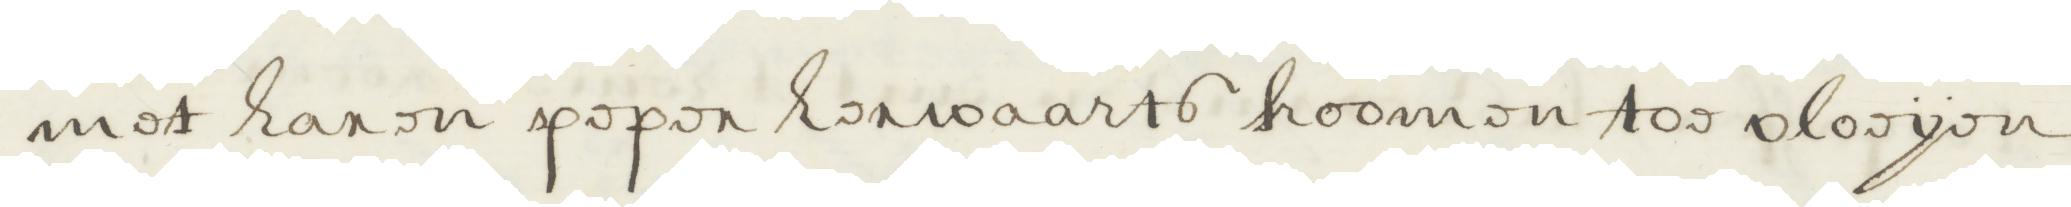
met haren peper herwaarts koomen toe vloeijen
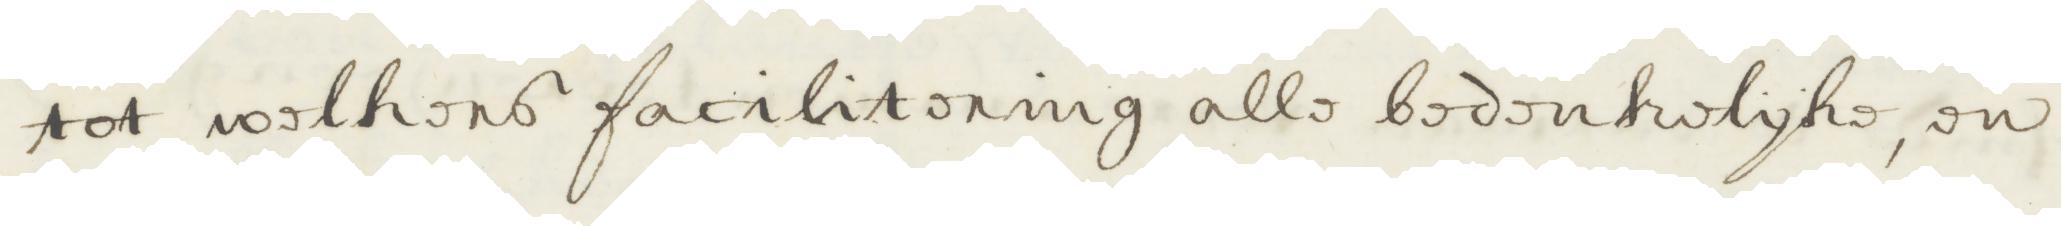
tot welkers facilitering alle bedenkelijke, en
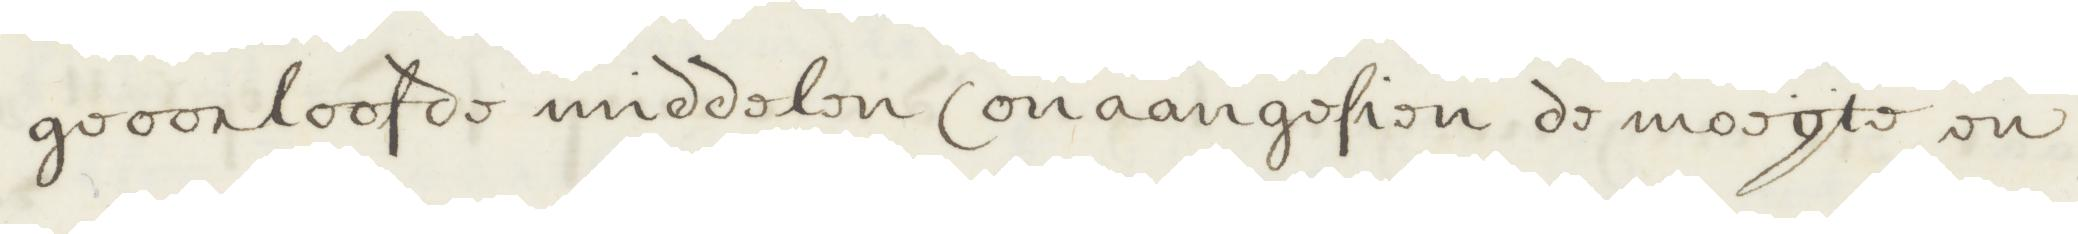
geoorloofde middelen (onaangesien de moeijte, en
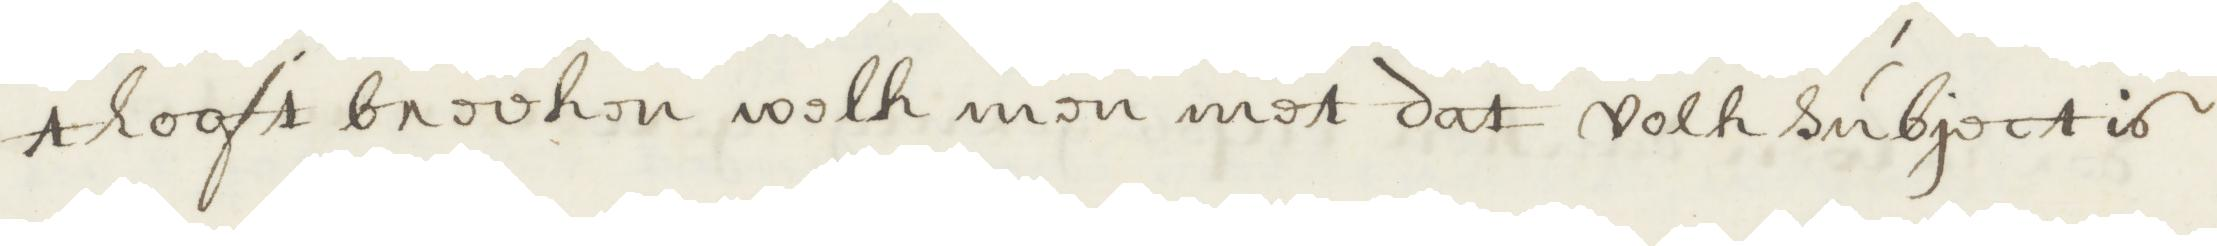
t hooft breeken welk men met dat volk subject is
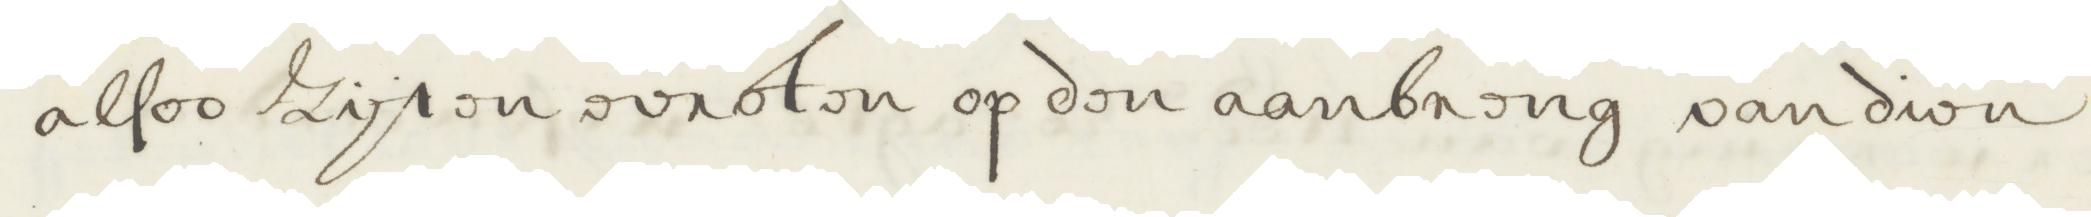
alsoo zij ten eersten op den aanbreng van dien
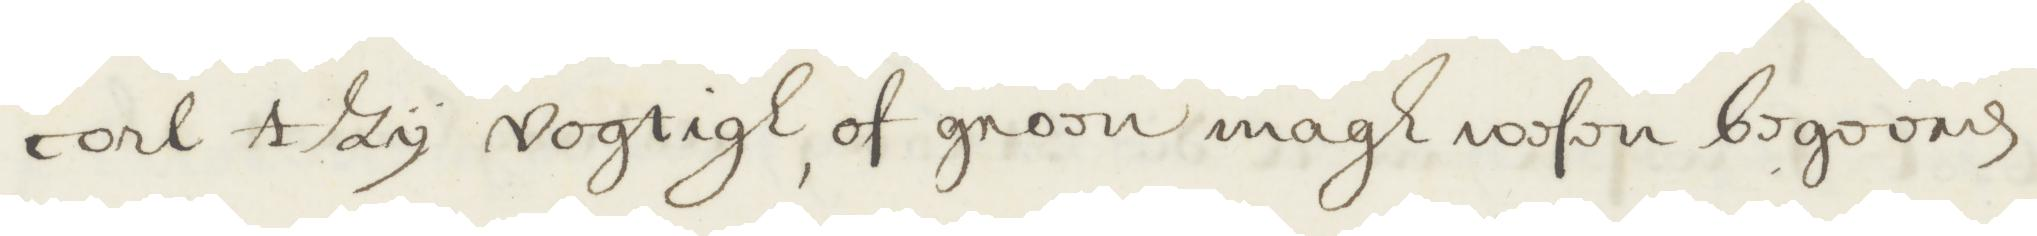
corl t zij vogtigh, of groen magh wesen begeeren
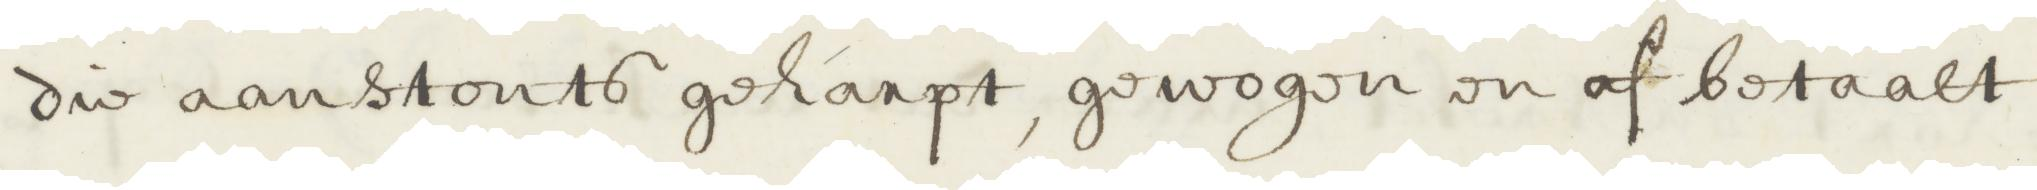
die aanstonts geharpt, gewogen en af betaalt
